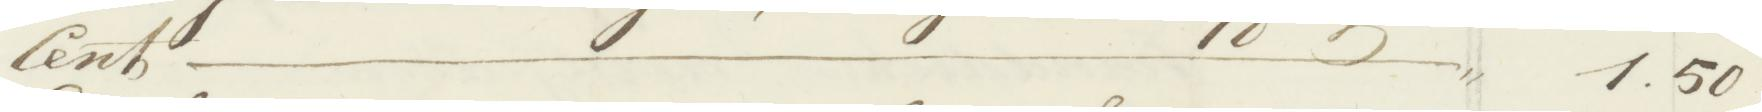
Cent —„ 1.50
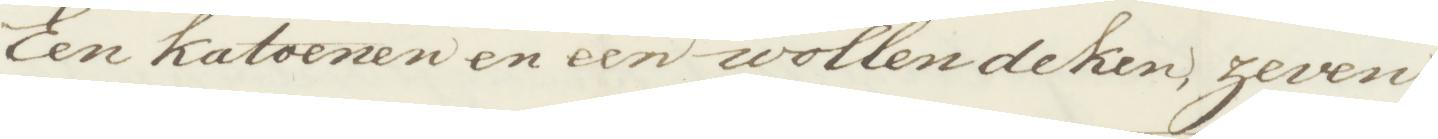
Een katoenen en een wollen deken, zeven
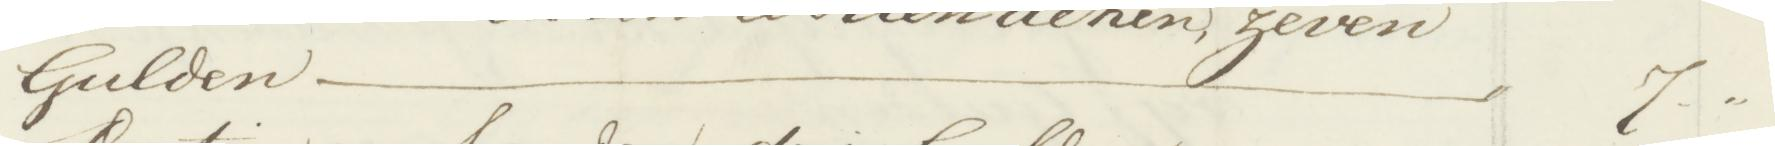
Gulden — „ 7.„
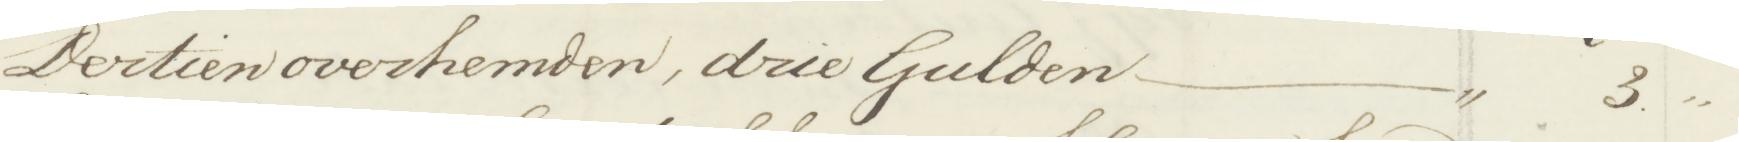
Dertien overhemden, drie Gulden—„ 3. „
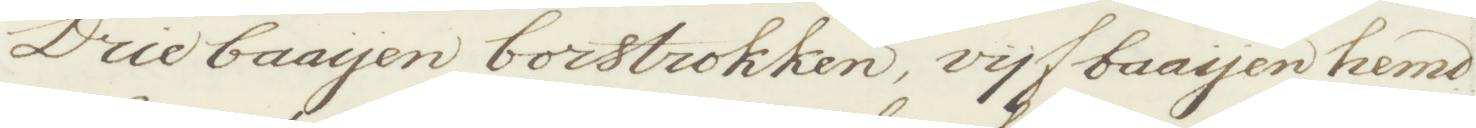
Drie baaijen borstrokken, vijf baaijen hemd
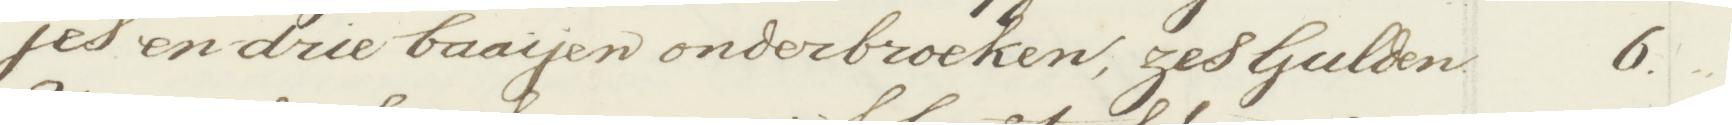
jes en drie baaijen onderbroeken, zes Gulden. 6.„
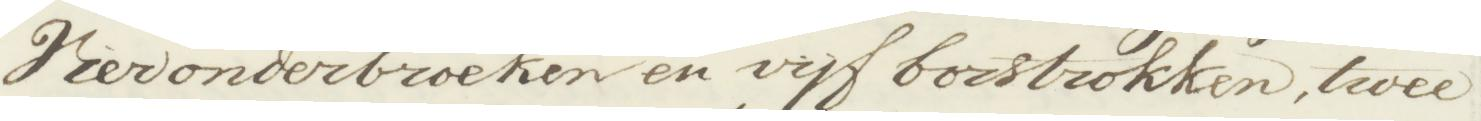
Vier onderbroeken en vijf borstrokken, twee
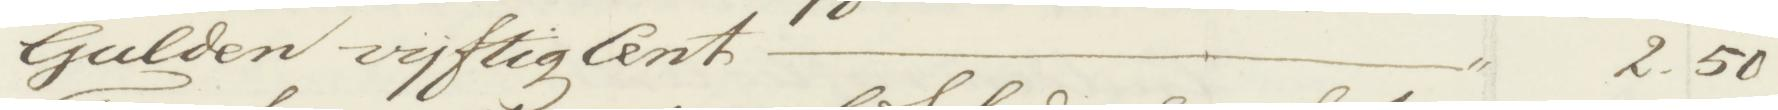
Gulden vijftig Cent —„ 2,50
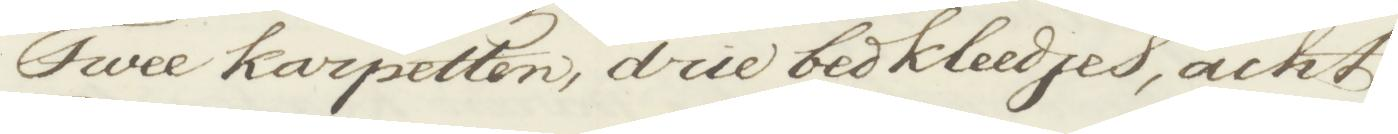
Twee karpetten, drie bedkleedjes, acht
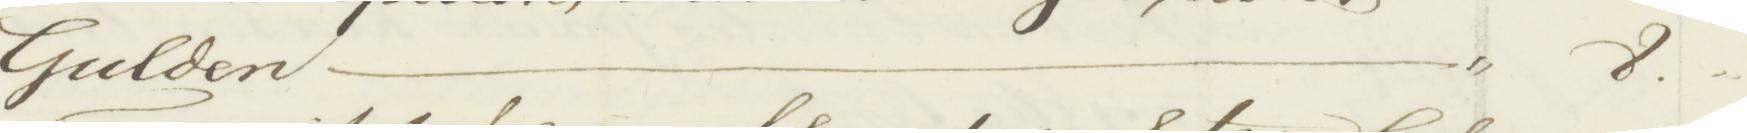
Gulden —„ 8. „
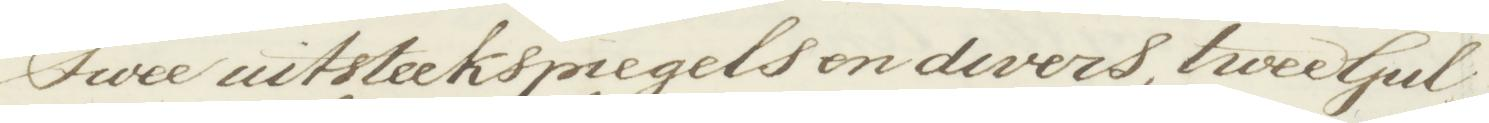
Twee uitsteekspiegels en divers, twee Gul
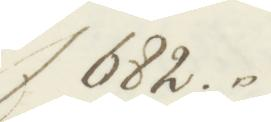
ƒ 682.„
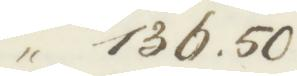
„ 136.50
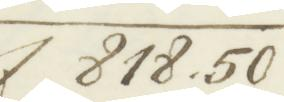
ƒ 818.50
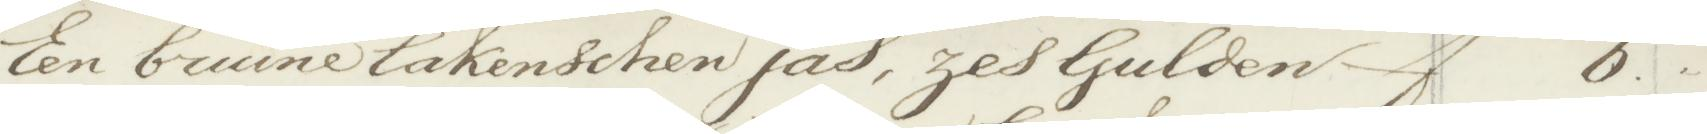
Een bruine lakenschen jas, zes Gulden ƒ 6. „
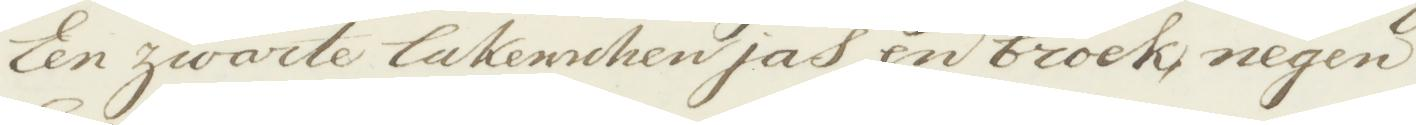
Een zwarte lakenschen jas en broek negen
